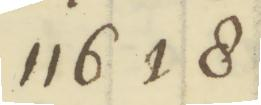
116 1 8
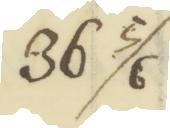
36 5/6
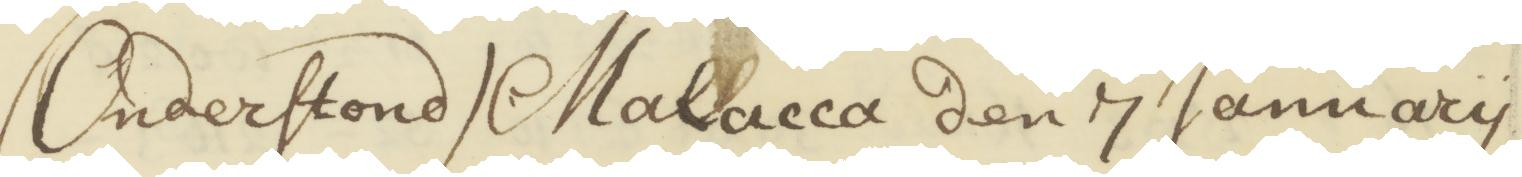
(Onderstond) Mallacca den 7 Januarij
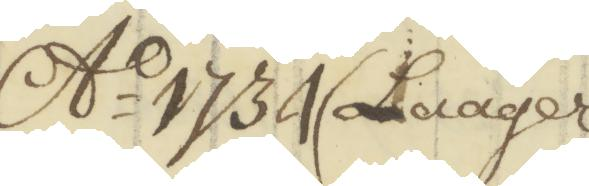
A=o 1734 (Laager
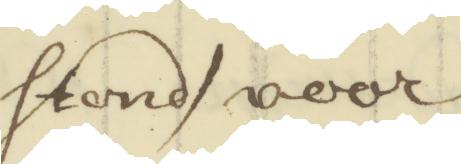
stond) voor
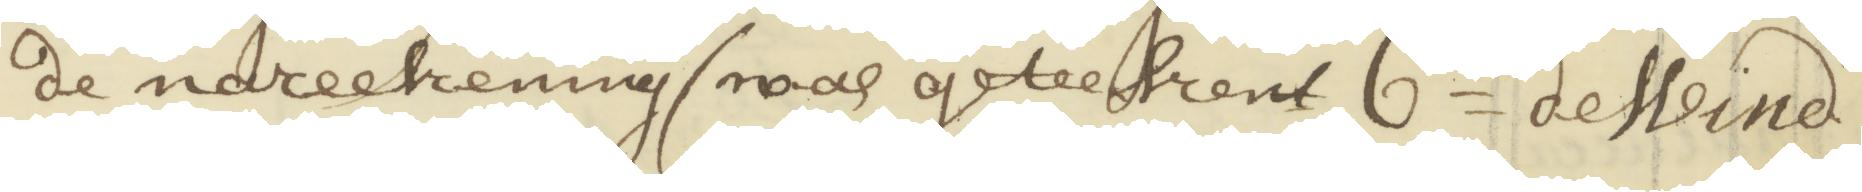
de nareekening (was geteekent C=len de Wind.
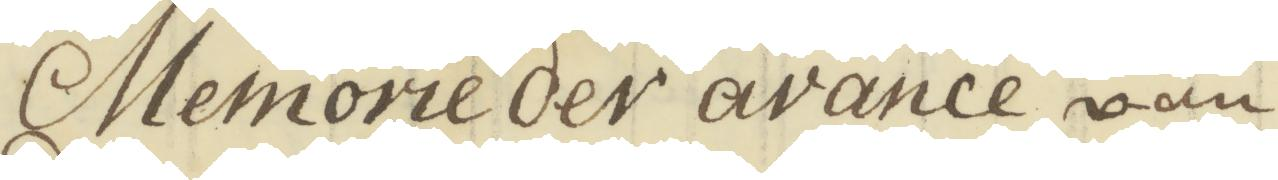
Memorie der avance van
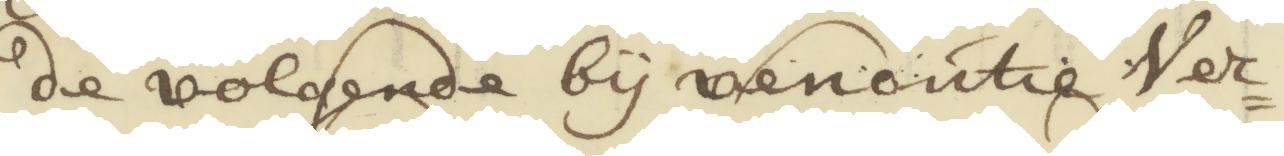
de volgende bij vendutie Ver=
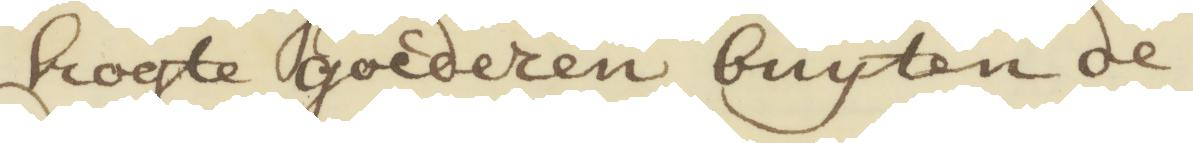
kogte goederen buijten de
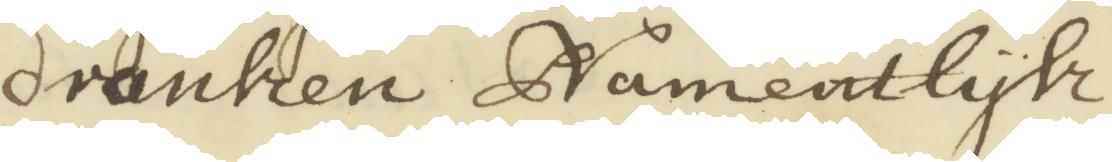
dranken Namentlijk
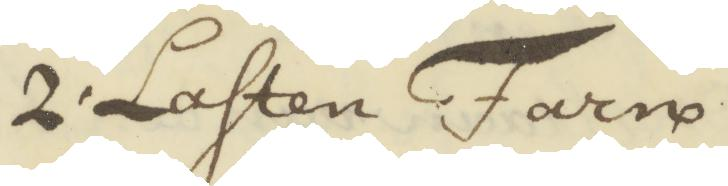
2. Lasten Tarwe
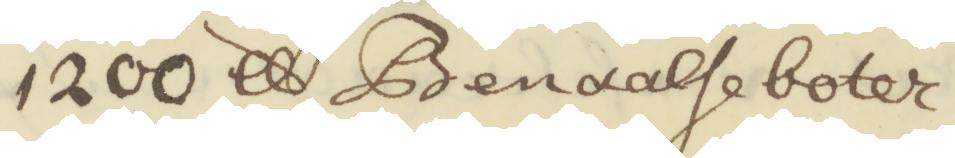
1200 lb Benaalse boter
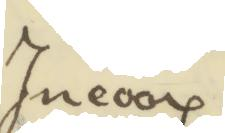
Jncoop
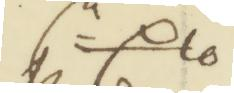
p=r Cto
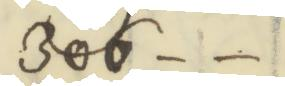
306 - -
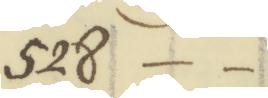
528 - -
